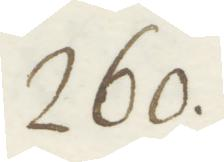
260.
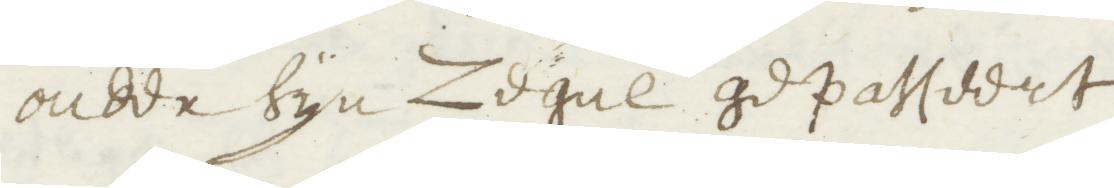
onder sijn Zegul gepasseert,
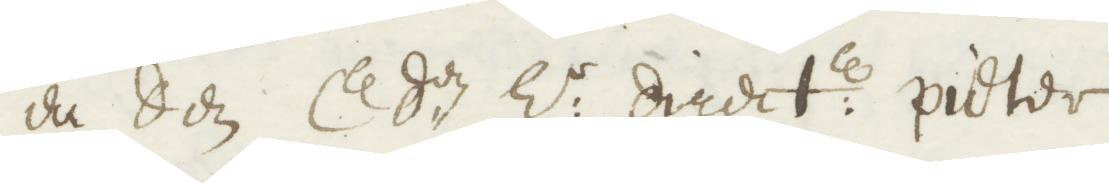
en den Ed„en h:r direct:r pieter
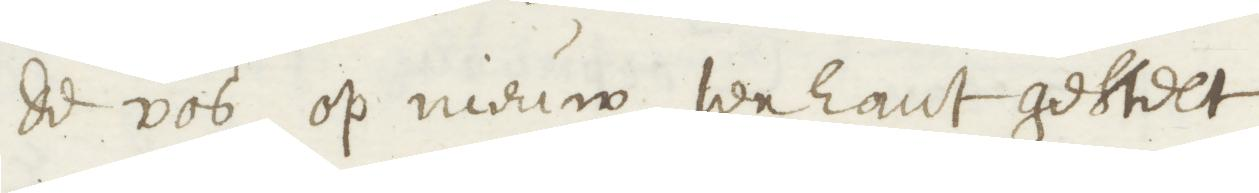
de vos op nieuw terhant gestelt
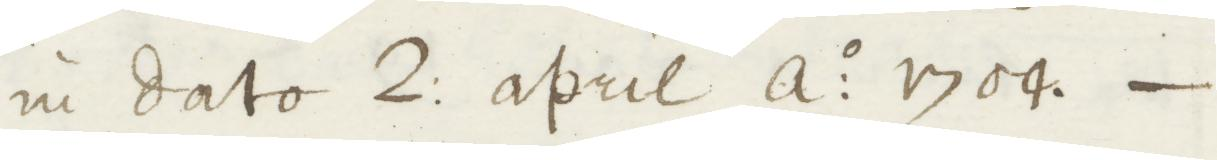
in dato 2: april a:o 1704. —
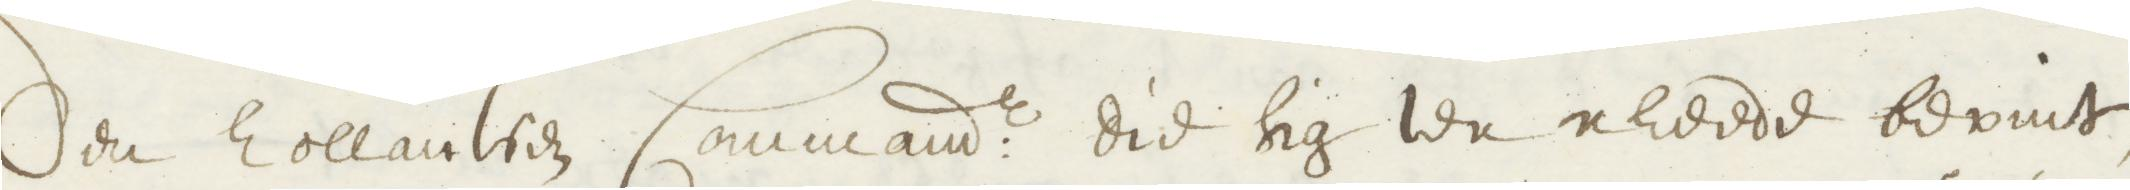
Den hollantsen Command:r die sig ter rheede bevint,
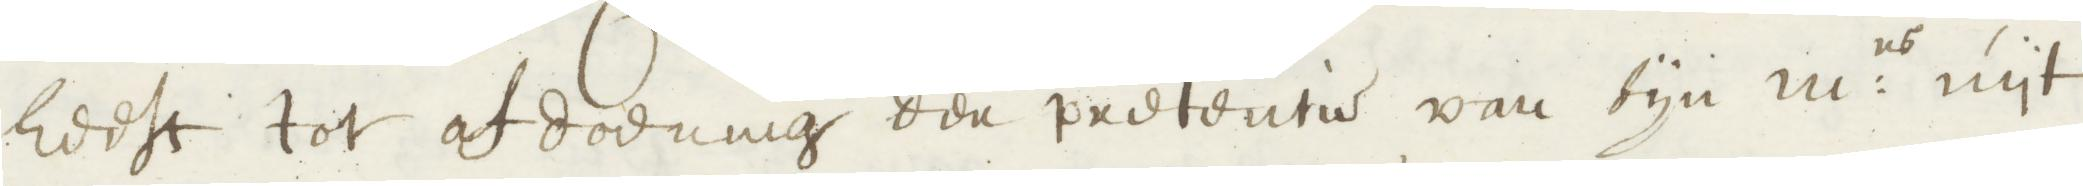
heeft tot afdoening der pretentie van sijn m:rs uijt
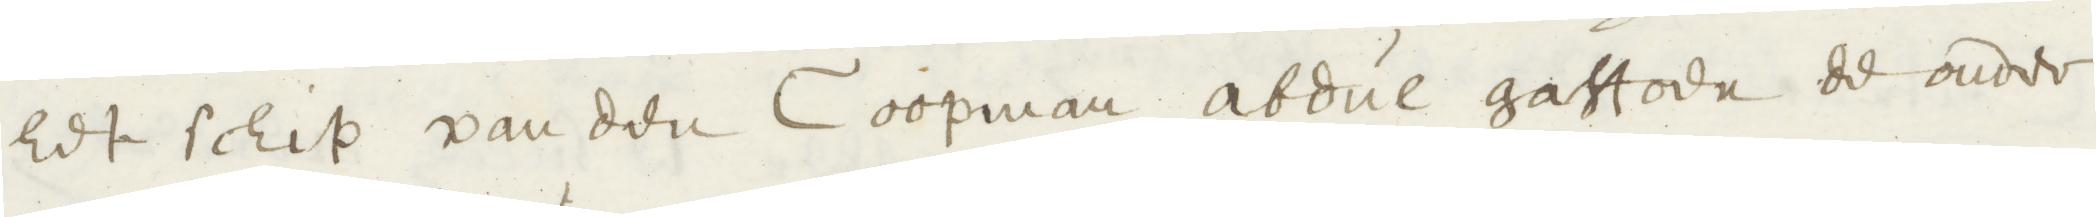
het schip van den Coopman abdul gaffoer de onder
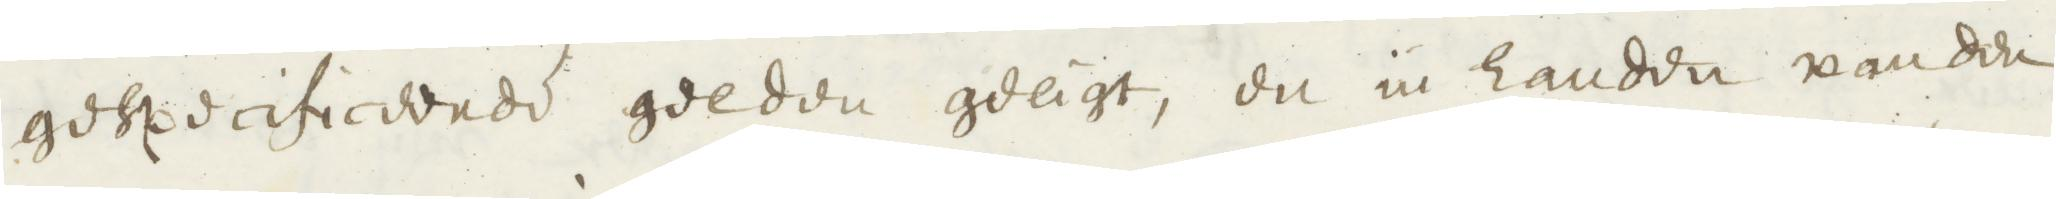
gespecificeerde gelden geligt, en in handen van den
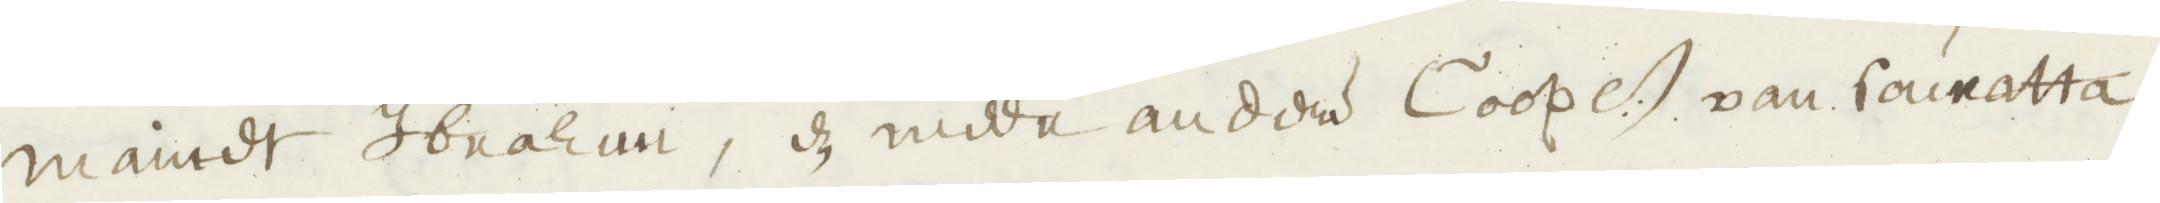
mantet Ibrahim, en meer andere Coopl van souratta
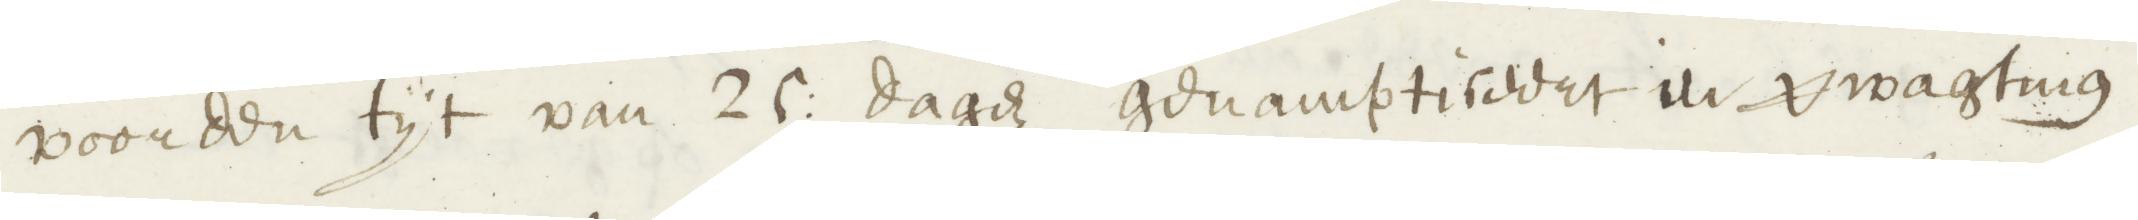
voor den tijt van 25: dagen genamptiseert en verwagting
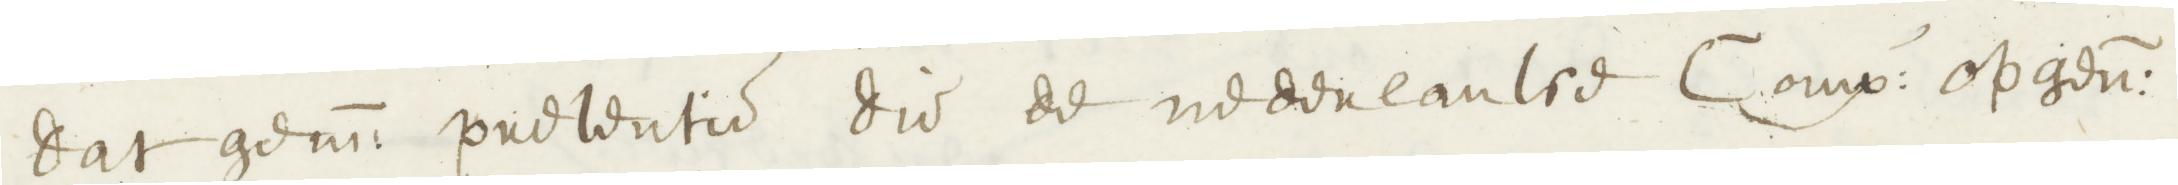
dat gem: pretentie die de nederlantse Comp: op gen:
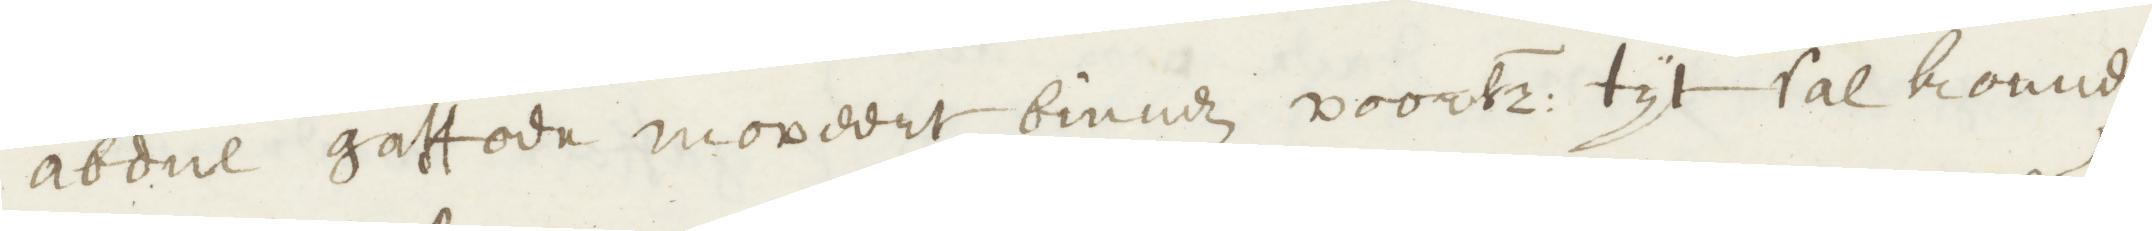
abdul gaffoer moveert binnen voorsz: tijt sal konnen
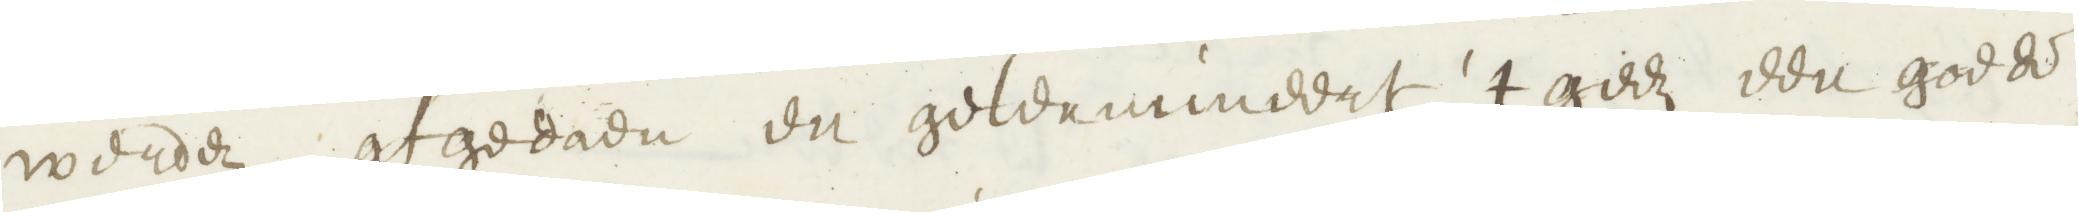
werden afgedaen en getermineert ’t geen een goede
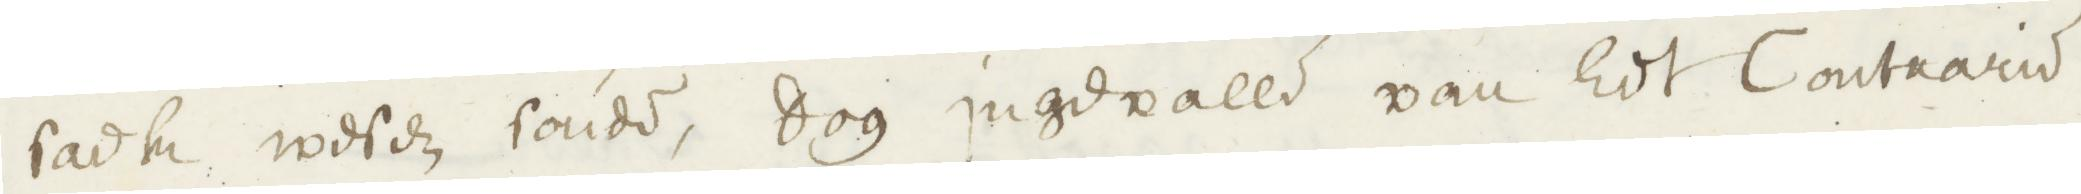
saek wesen soude, dog ingevalle van het Contrarie
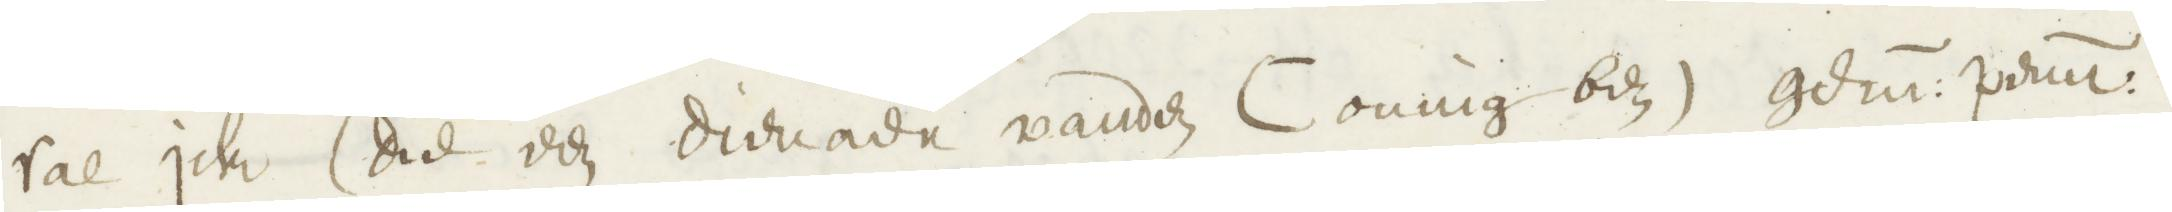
sal jck (die een dienaer vanden Coning ben) gem: penn:
